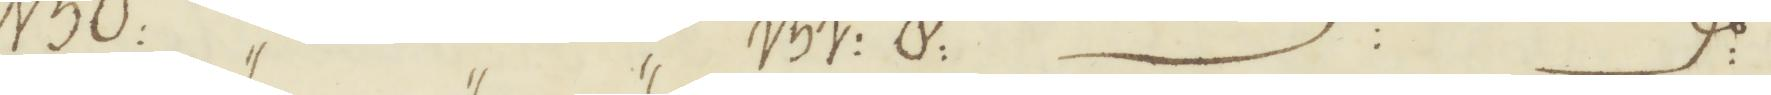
130: „ „ „ 131: 8: _:o _.o
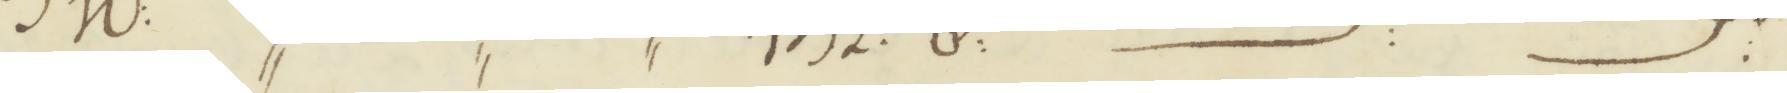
310. „ „ „ 132: 8: _:o _:o
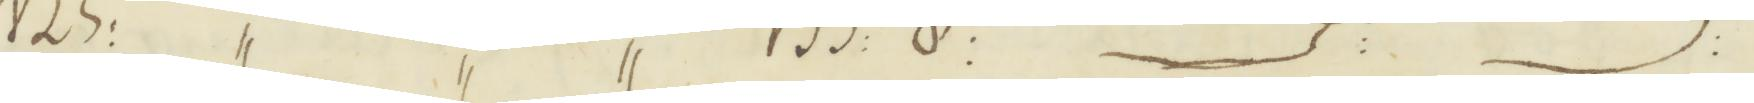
125. „ „ „ 133: 8: _:o _:o
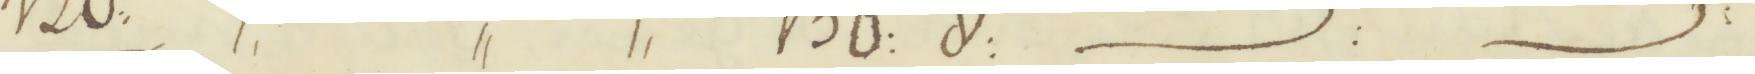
120: „ „ „ 136: 8: _:o _:o
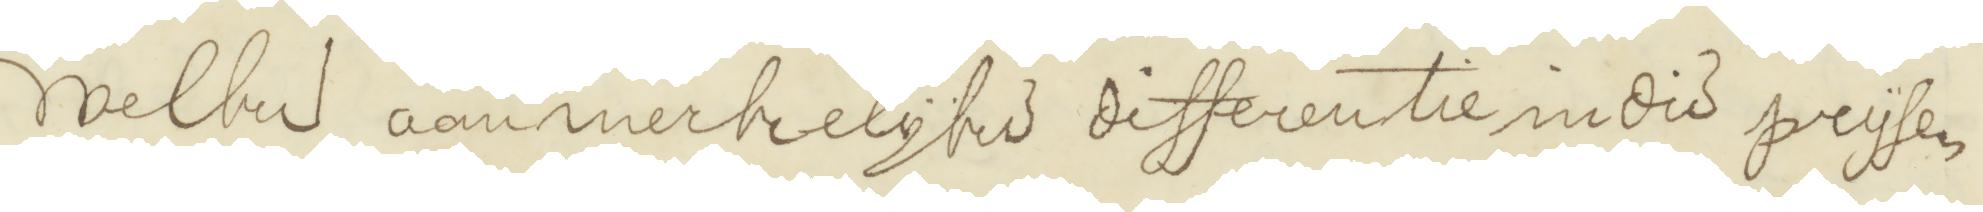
welke aanmerkelijke differentie in die prijsen
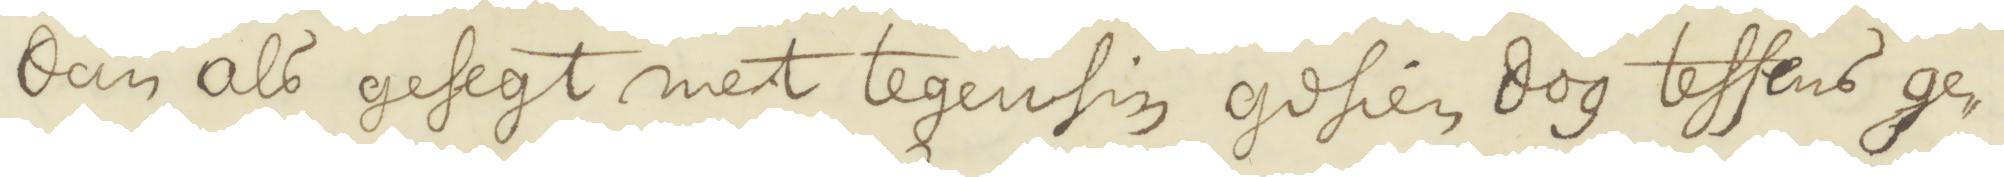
dan als gesegt met tegensin gesien dog teffens ge„
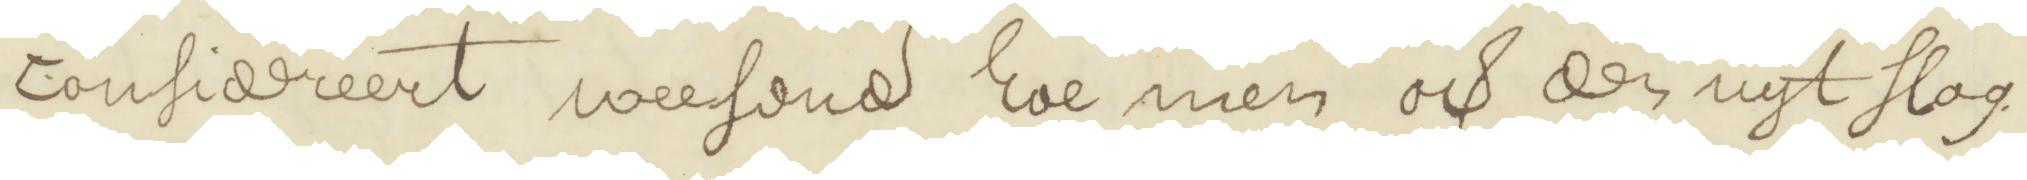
considereert weesende hoe men over den uijt slag
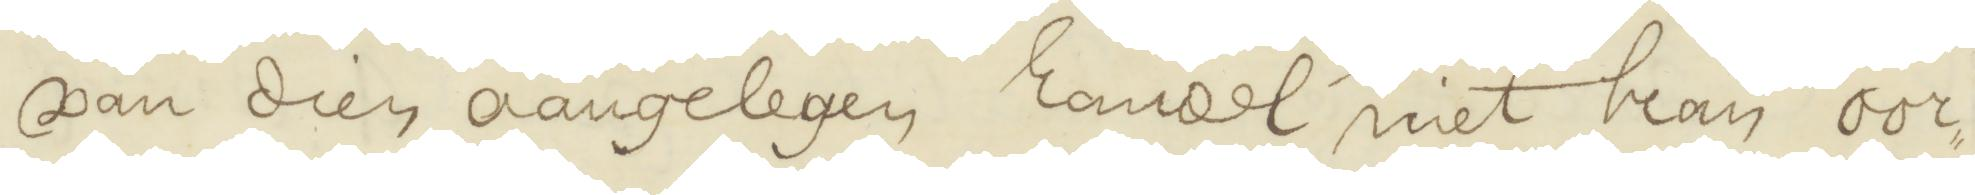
van dien aangelegen handel niet kan oor„
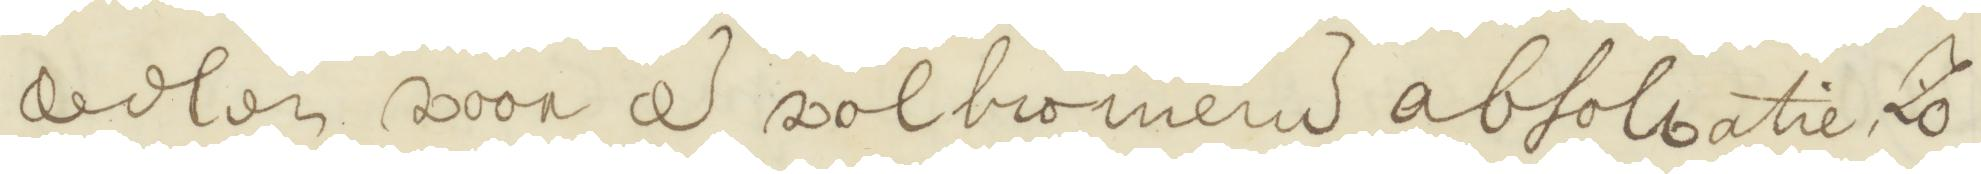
deelen voor de volkomene absolvatie, Zo
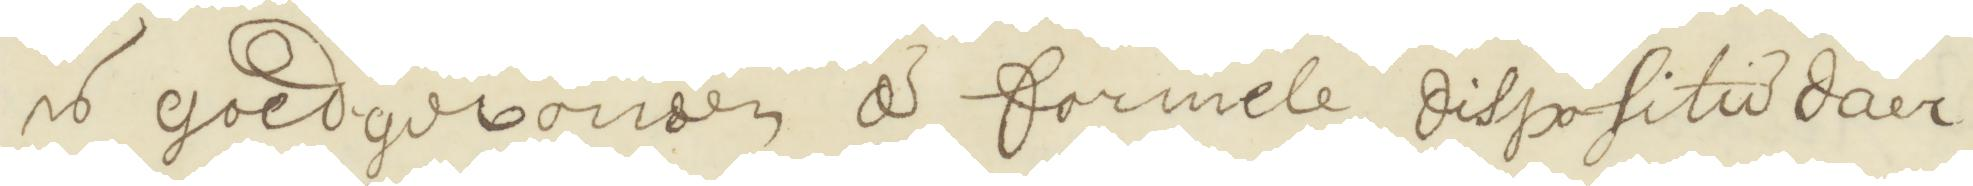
is goedgevonden de formele dispositie daer
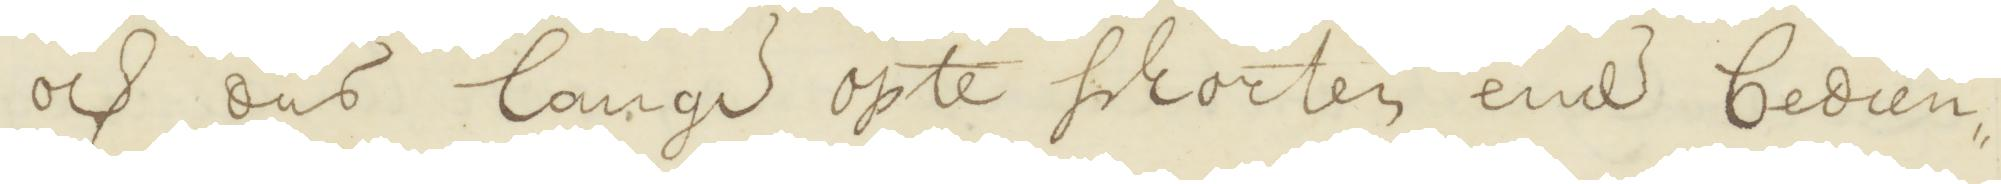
over dus lange opte schorten ende bedien„
